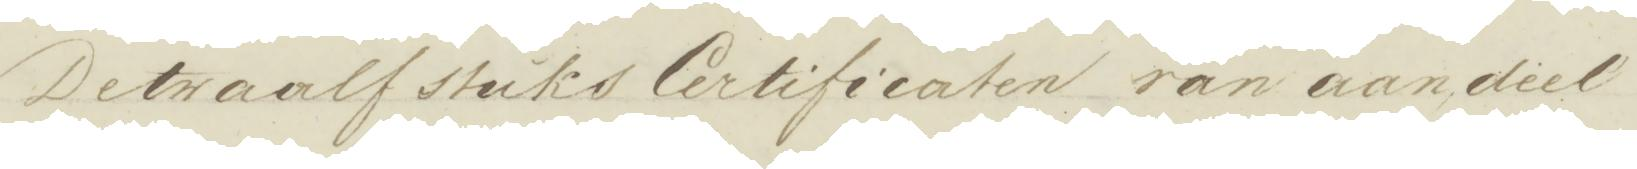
De twaalf stuks Certificaten van aandeel
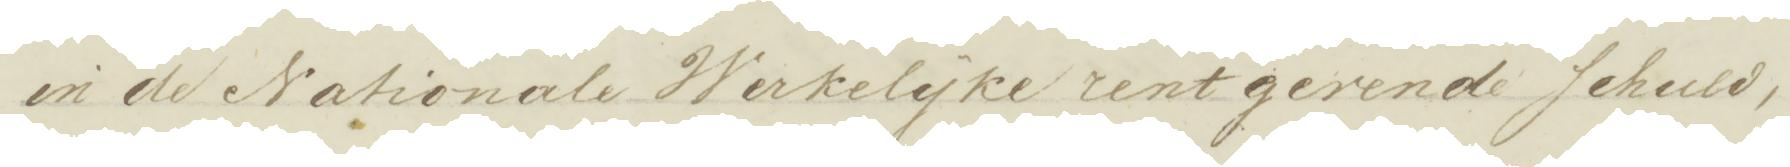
en de Nationale Werkelijke rentgevende Schuld,
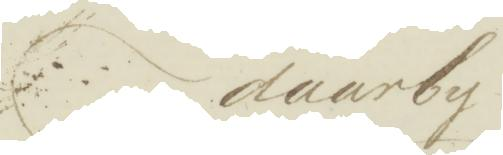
daarby
